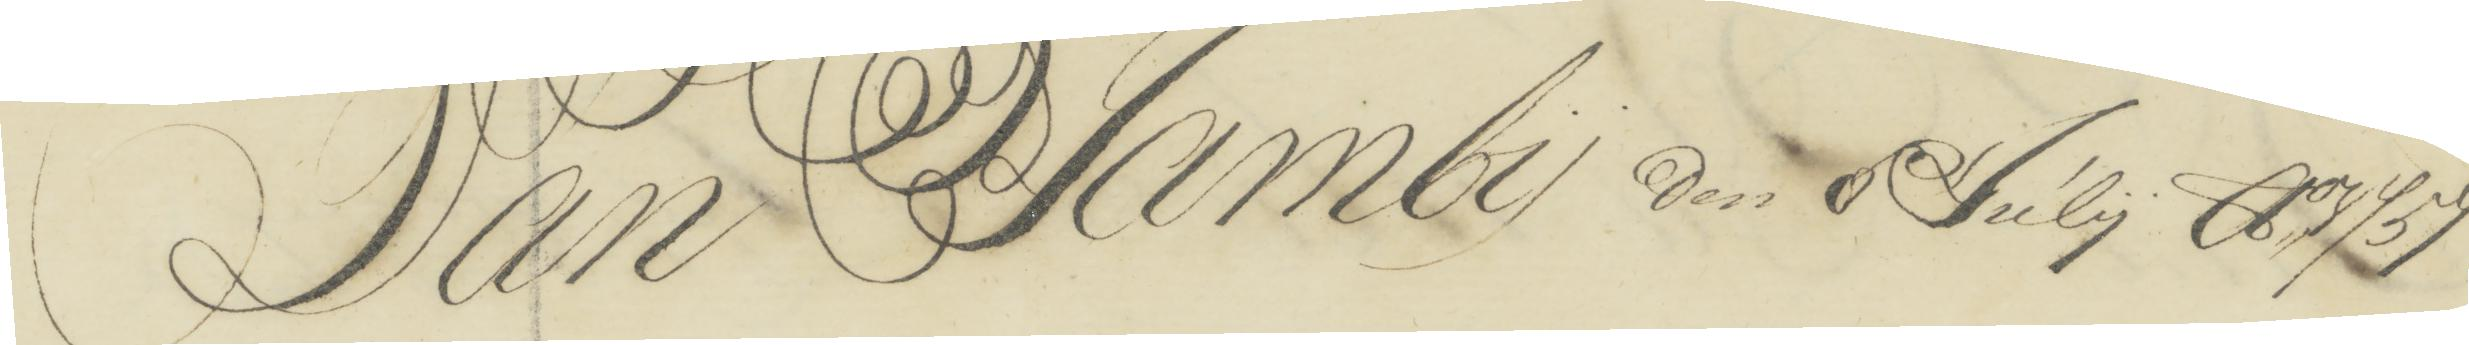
Van Iambij den 8 Iulij A„o 1757
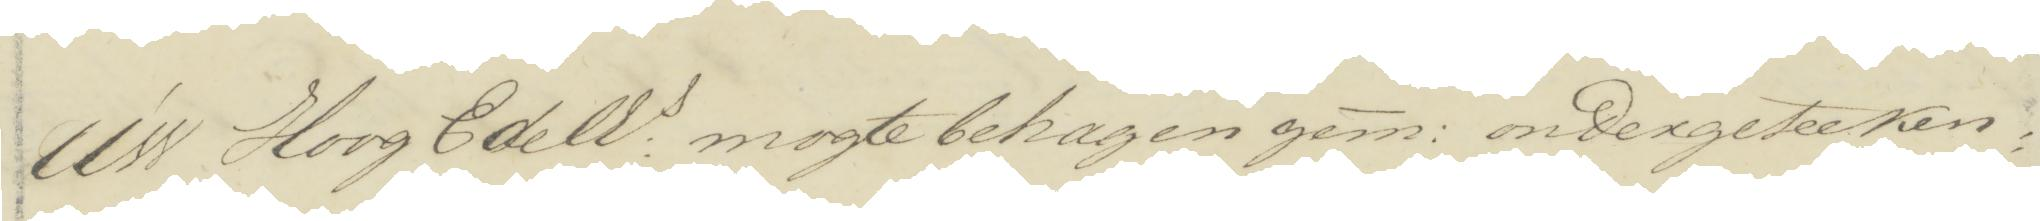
uw Hoog Edelh:s mogte behagen gem: ondergeteeken„
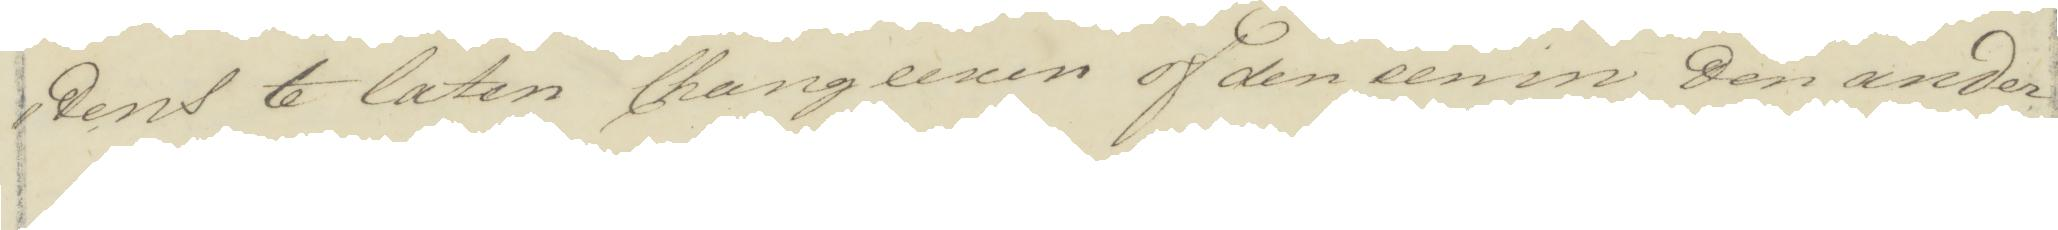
„dens te laten Changeeren of den een in den ander
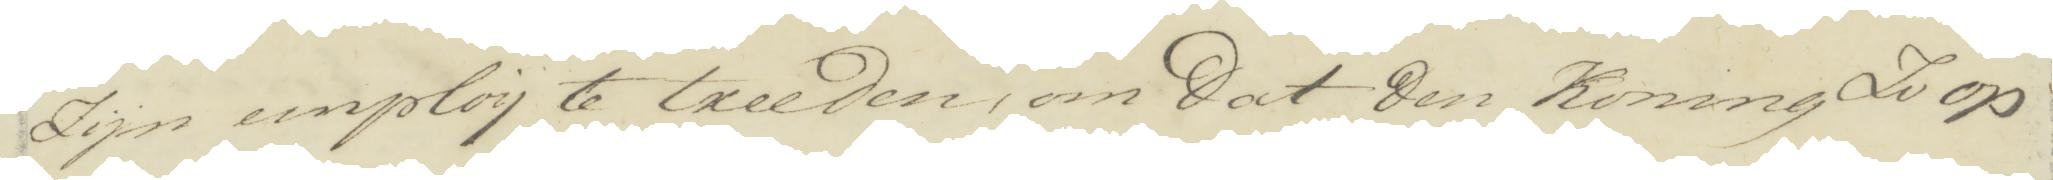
zijn emploij te treeden, om dat den koning zo op
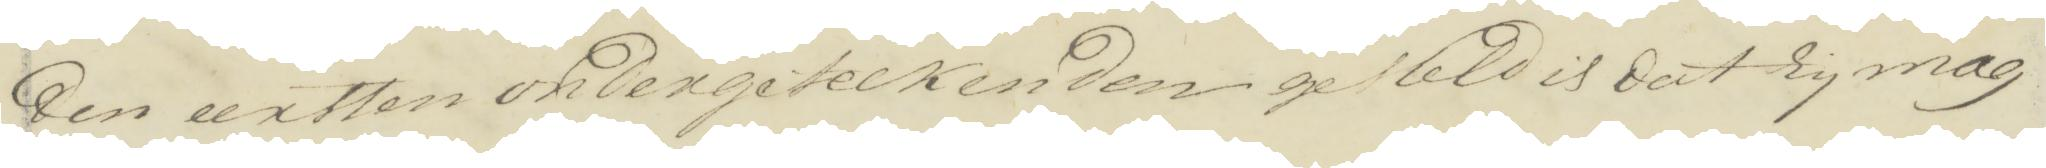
den eersten ondergeteekenden gesteld is dat hij mag
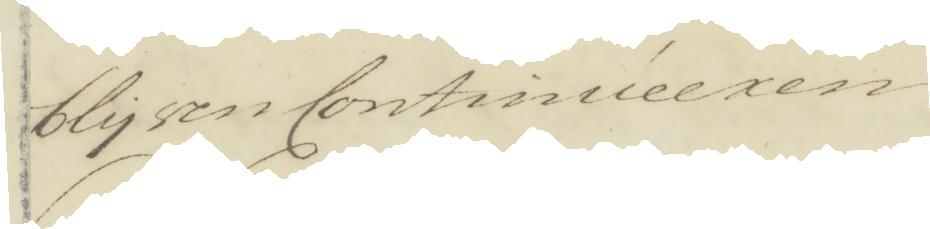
blijven Continueeren
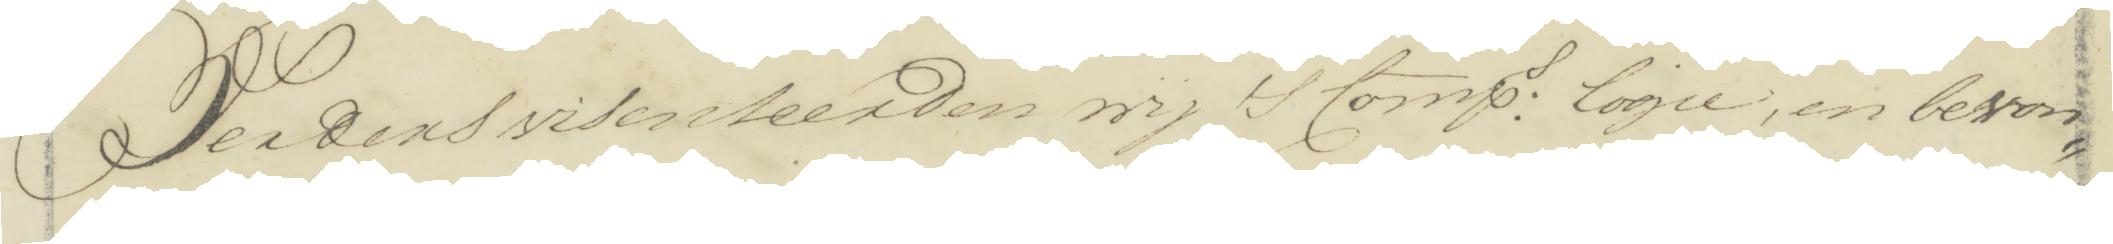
Verders visenteerden wij ’s Comp:s logie, en bevon„
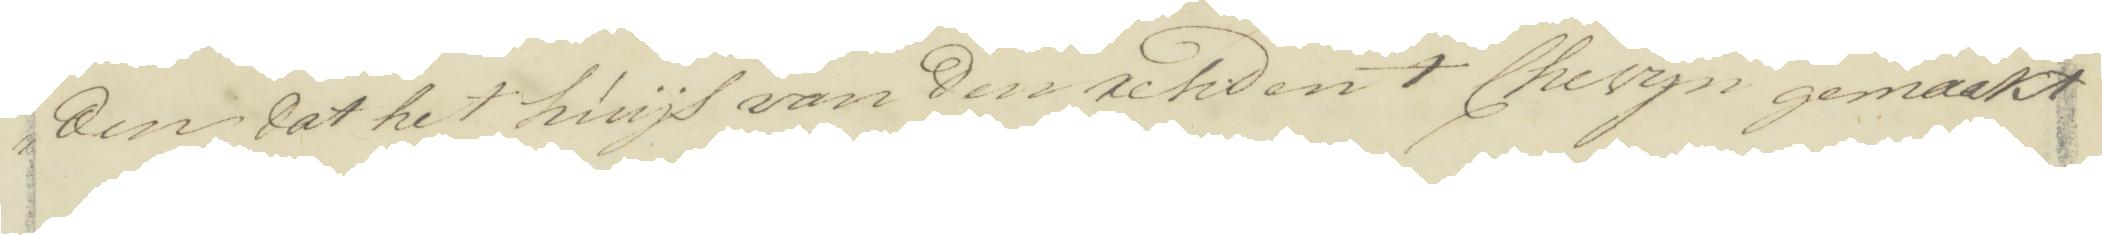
„den dat het huijs van den resident Chevijn gemaakt
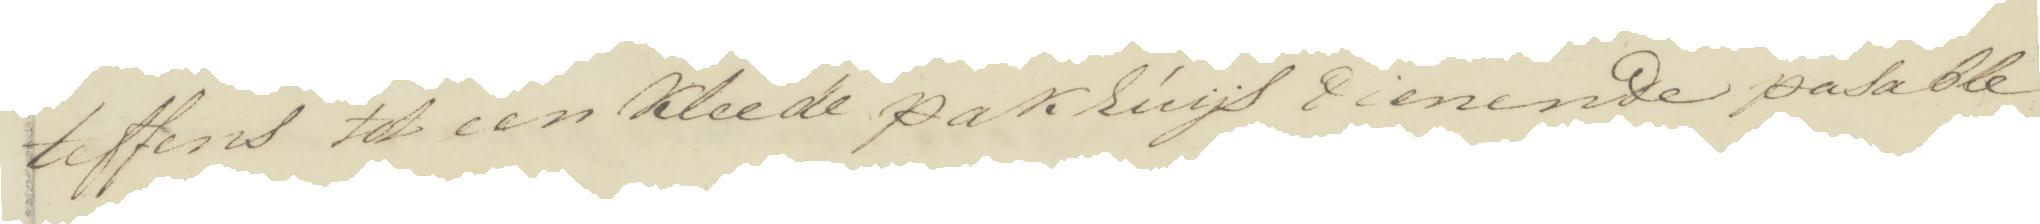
teffens tot een kleede pakhuijs dienende pasable
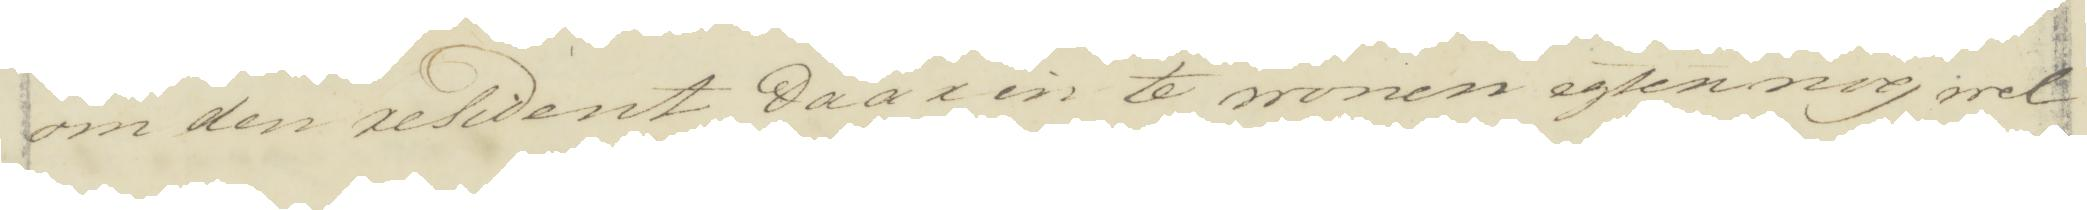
om den resident daarin te wonen egter nog wel
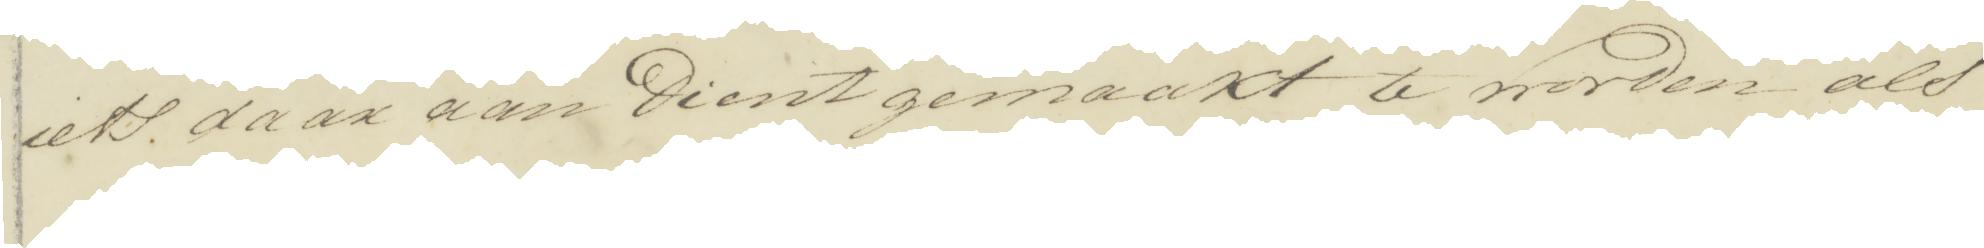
iets daar aan dient gemaakt te worden als
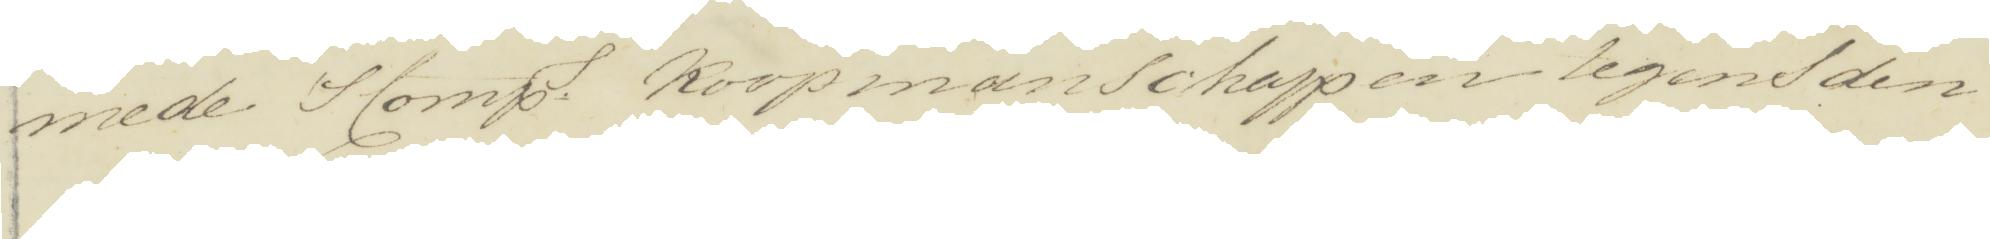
mede ’sComp=s koopmanschappen tegens den
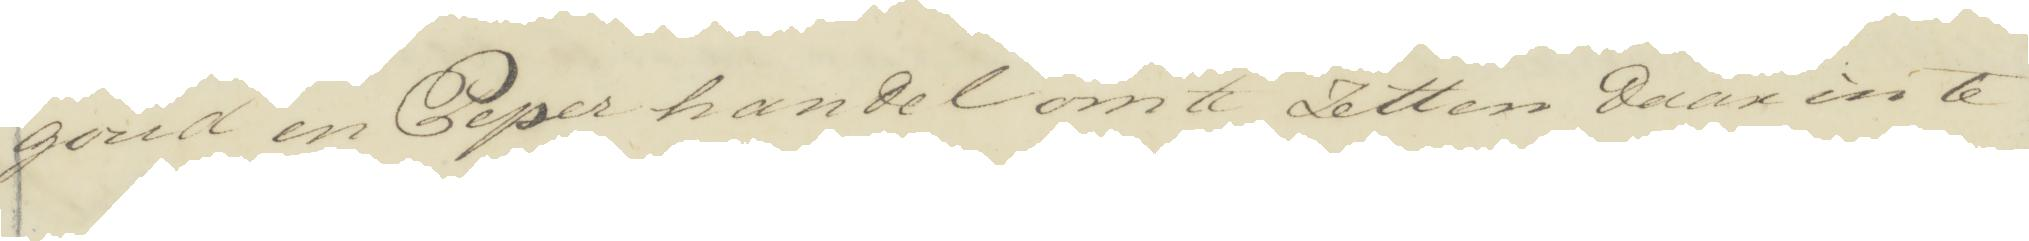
goud en Peper handel om te zetten daar in te
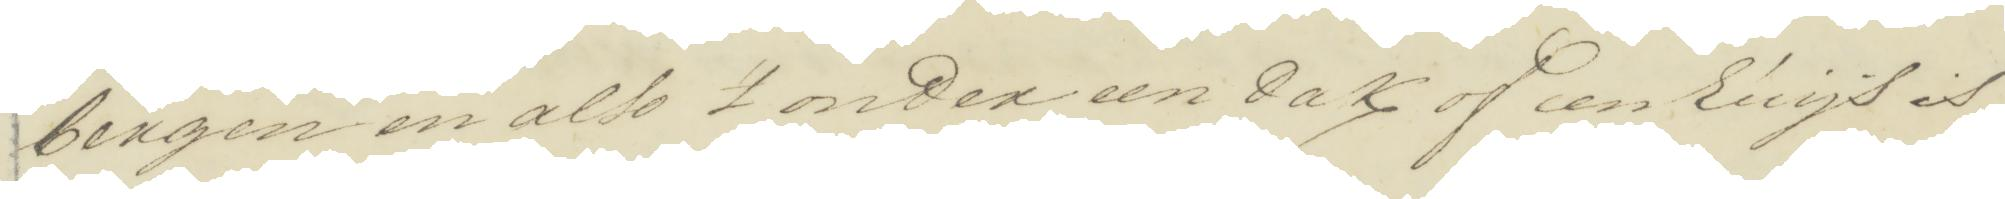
bergen en also ’t onder een dak of een huijs is,
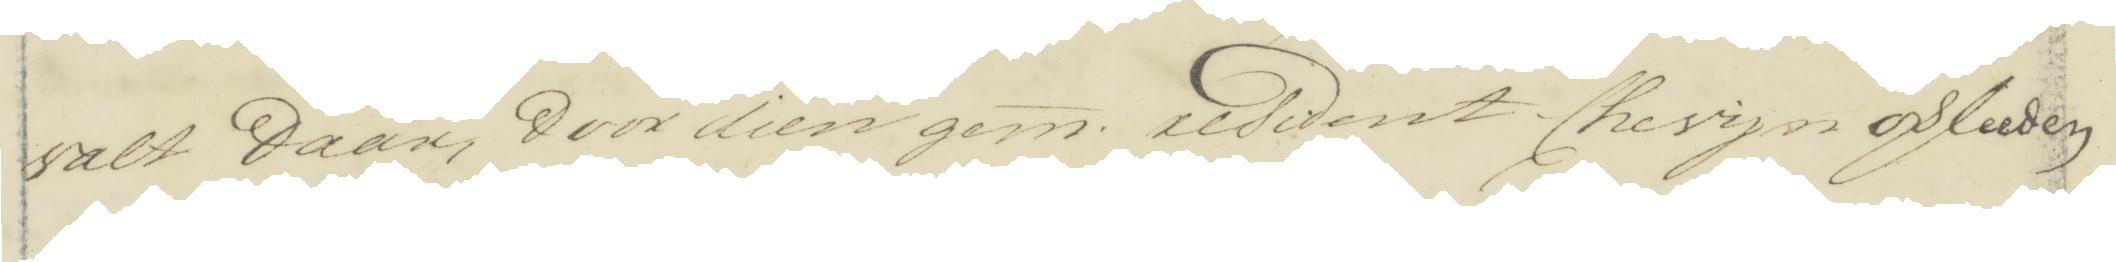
valt daar door dien gem: resident Chevijn overleeden
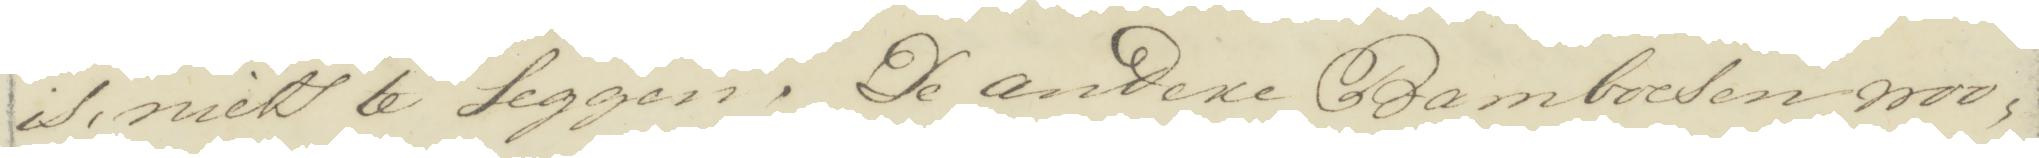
is, niets te seggen. De andere Bamboesen woo„
